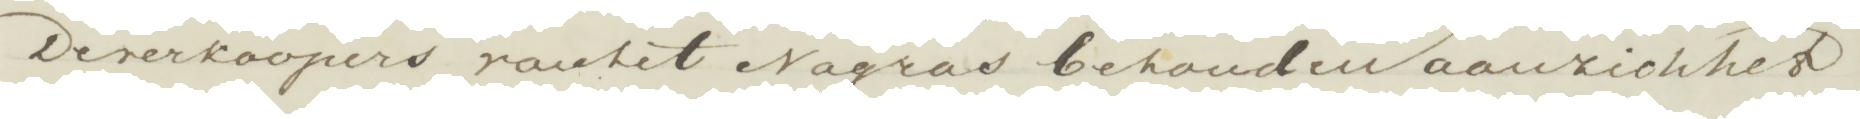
De verkoopers van het Nagras behouden aan zich het
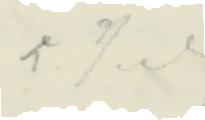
5. Iul
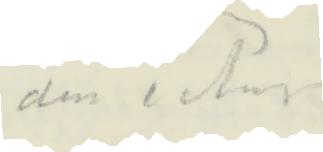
den 1 Aug
